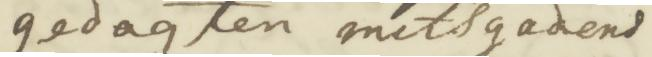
gedagten mitsgaders
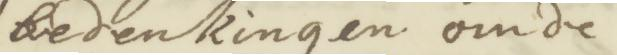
bedenkingen om de
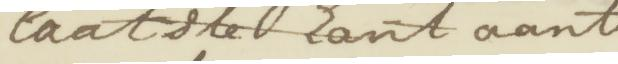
laatste hant aant
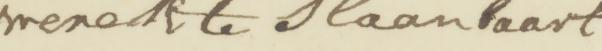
werck te slaan baart
